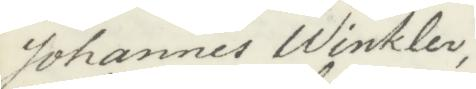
Johannes Winkler,
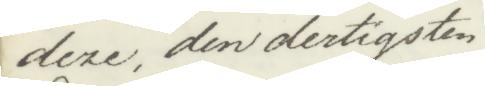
deze, den dertigsten
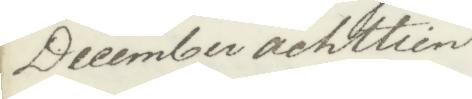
December achttien
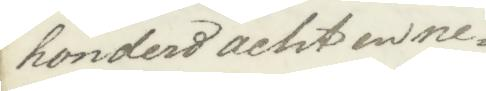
honderd acht en ne„
